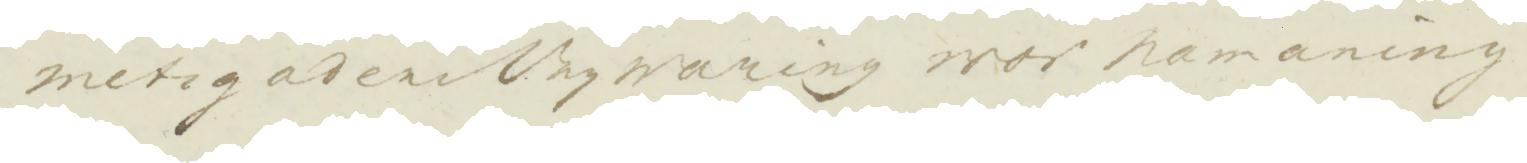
mitsgaders Vrywaring voor namaning
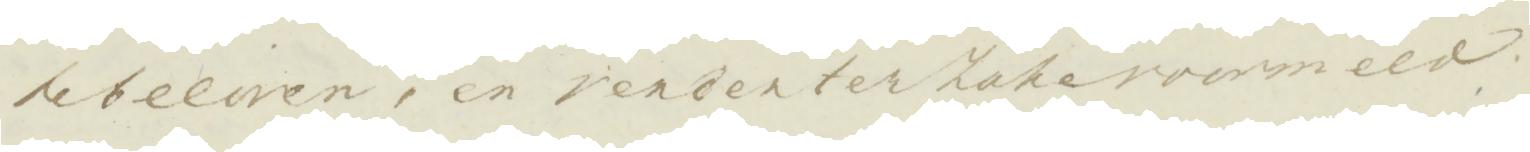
te beliven, en verder ter zake voormeld
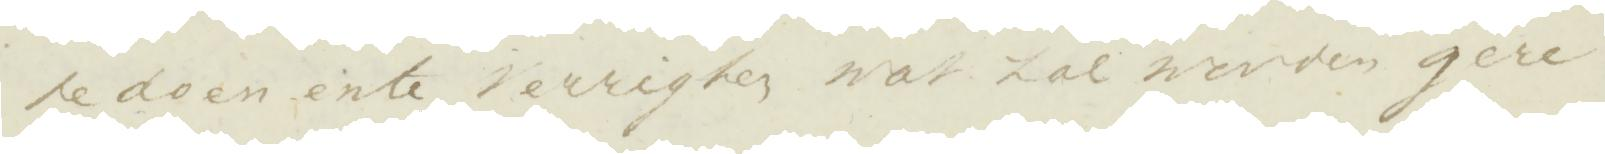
te doen en te verrigten wat zal worden gere
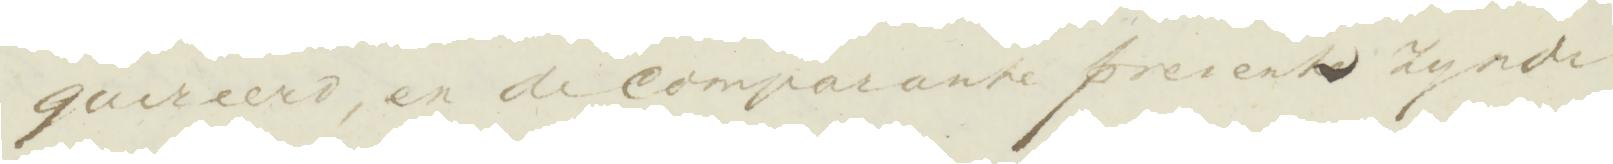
quireerd, en de comparante presente zynde
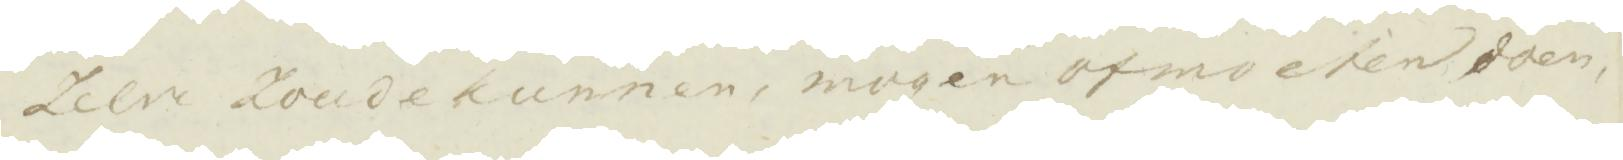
zelve zoude kunnen, mogen of moeten doen,
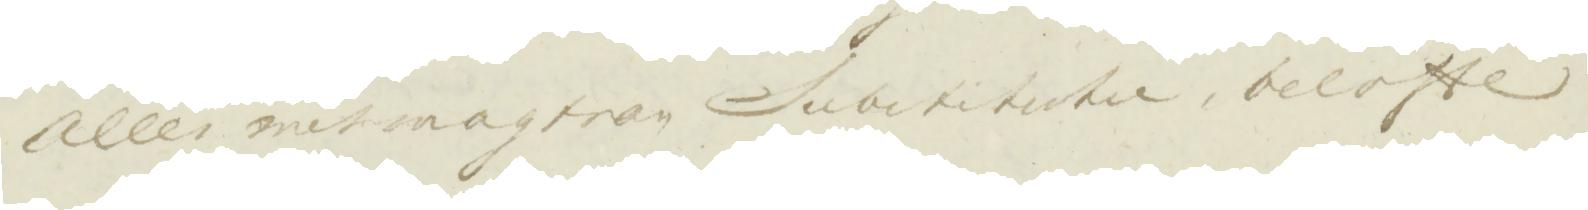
alles met magt van Substitutie, belofte
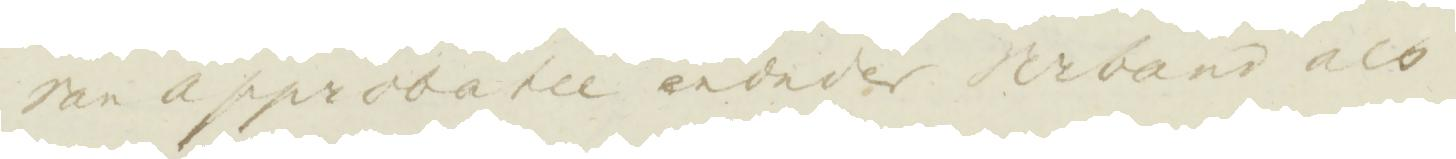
van approbatie en onder verband als
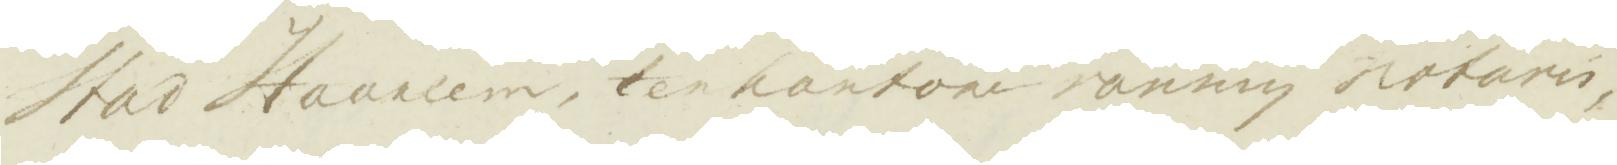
Stad Haarlem, ten kantore van my notaris,
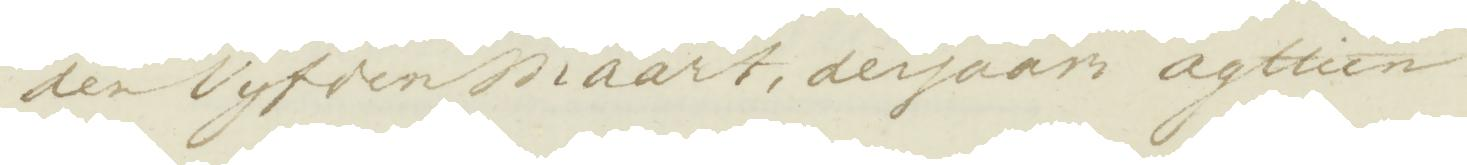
den vyfden maart, des jaars agttien
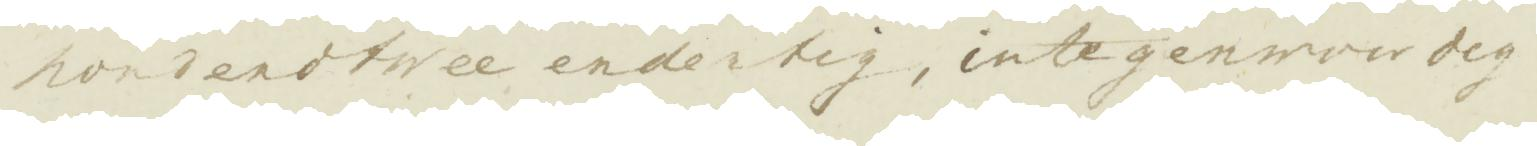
honderd twee en dertig, in tegenwoordig
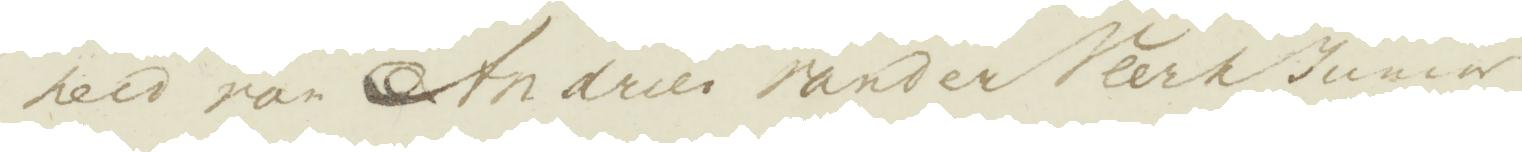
heid van Andries vander Vlerk Junior
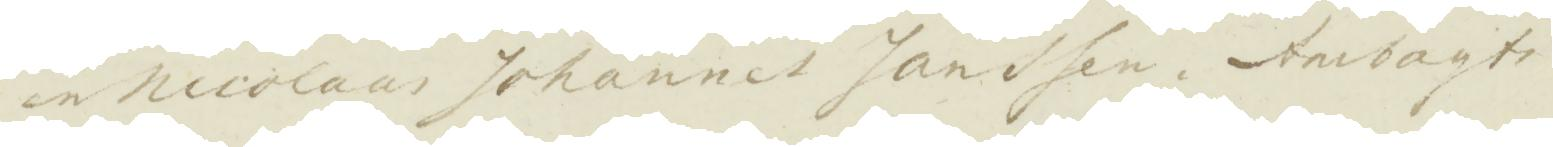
en Nicolaas Johannes Janssen, Ambagts
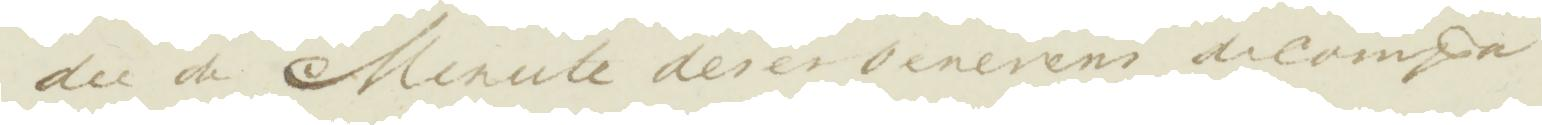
die de Minute deses benevens de compa
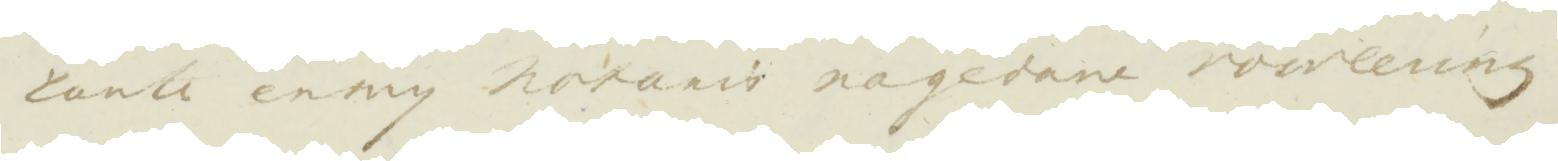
rante en my notaris nagedane voorlezing
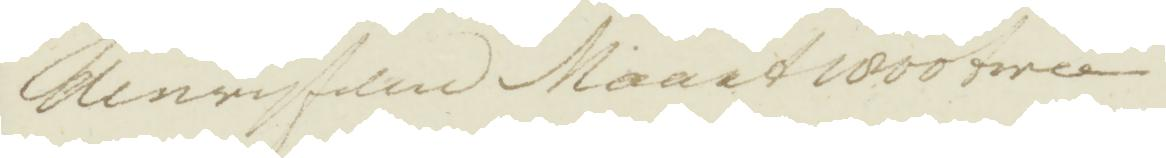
den vyfden Maart 1800 twee
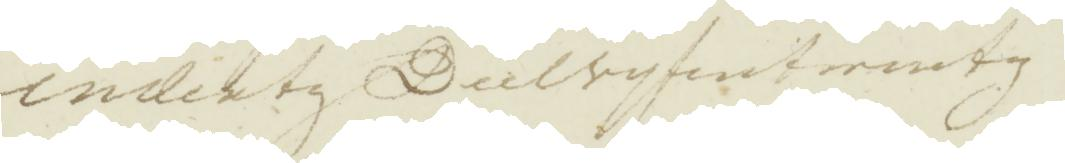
en dertig Deel vyfentwintig
